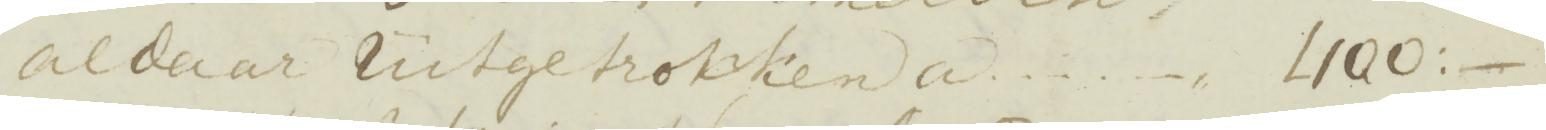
aldaar uitgetrokken a . . . . . – „ 400:—
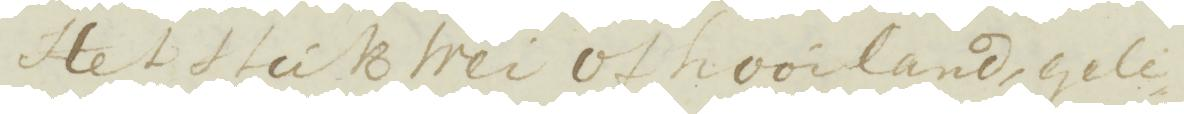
Het stuk wei of hooiland, gele„
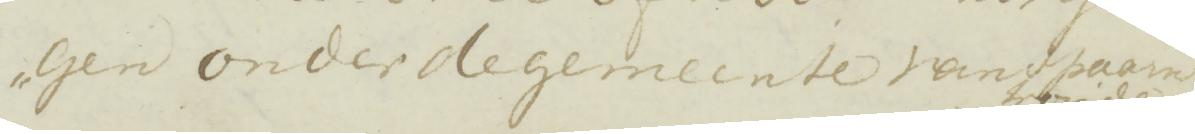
„gen onder de gemeente van spaarn
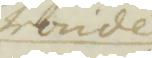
woude
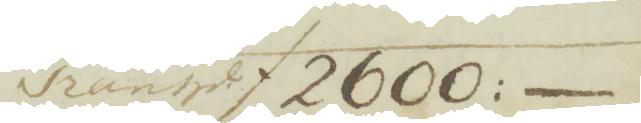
Transp.e ƒ 2600: —
